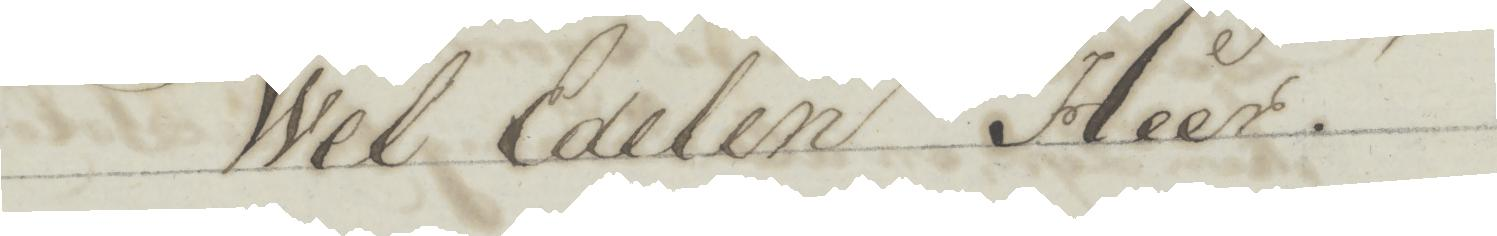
Wel Edelen Heer!
